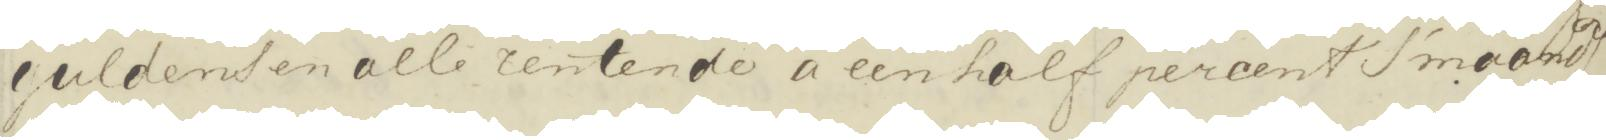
Guldens en alle rentende a een half percent s'maands
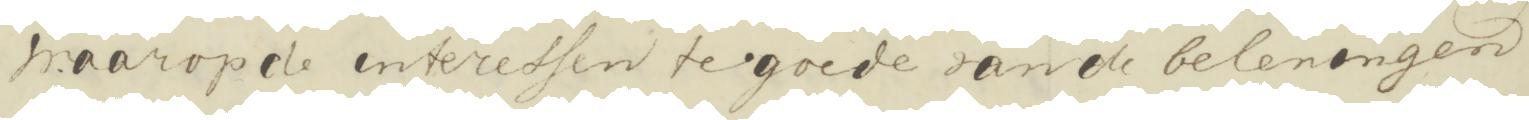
waarop de interessen te goede van de beleningen
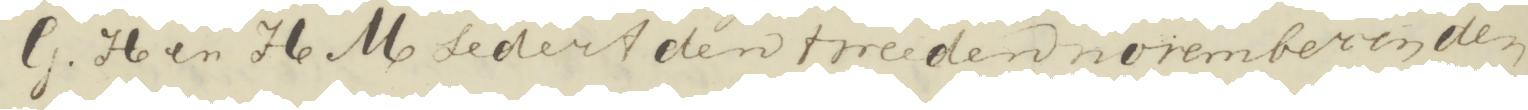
G. H en H M sedert den tweeden november en den
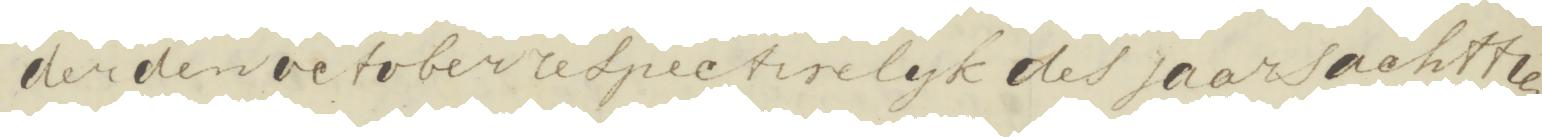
derden october respectivelyk des jaars achttien
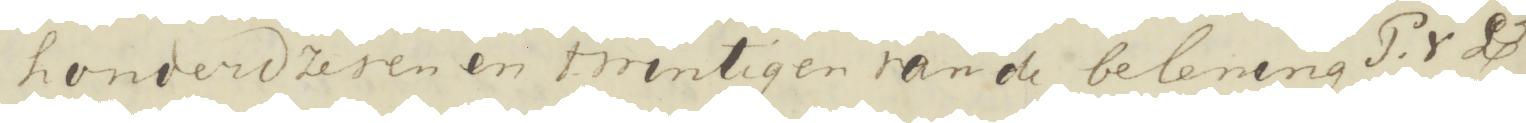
honderd zeven en twintig en van de belening P. v L.
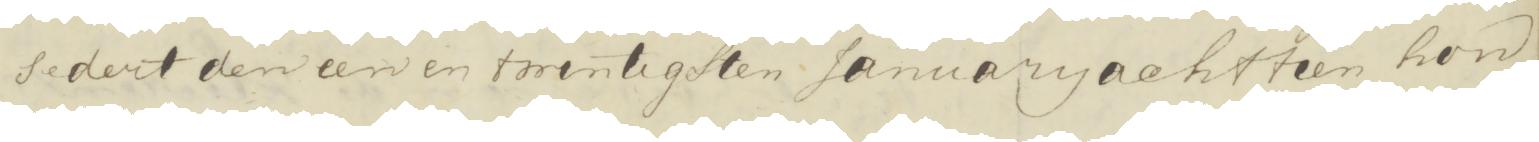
sedert den een en twintigsten January achttien hon
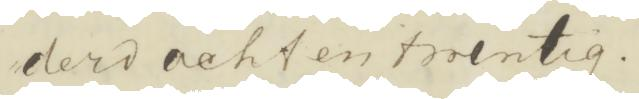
„derd acht en twintig.
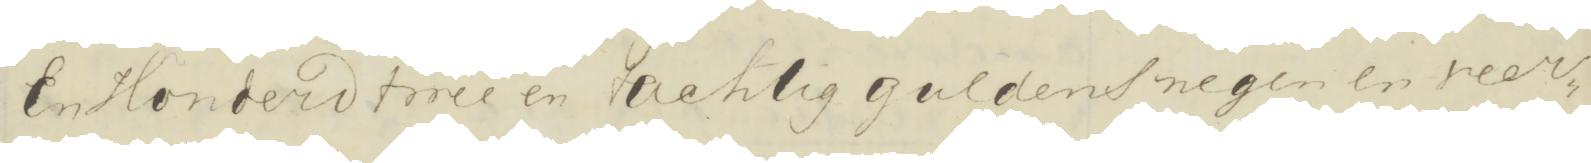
En Honderd twee en tachtig guldens negen en veer„
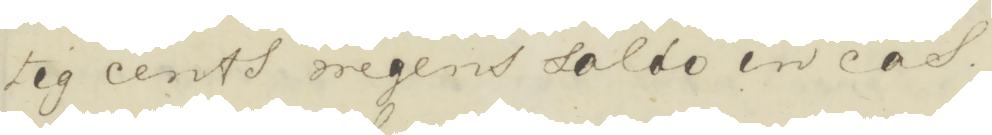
tig cents wegens saldo in cas.
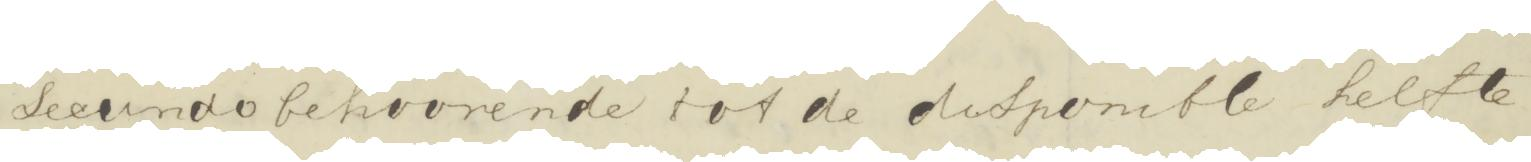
Secundo behoorende tot de disponible helfte
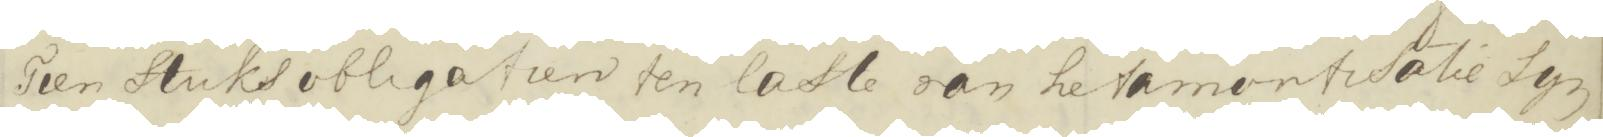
Tien stuks obligatien ten laste van het amortisatie syn
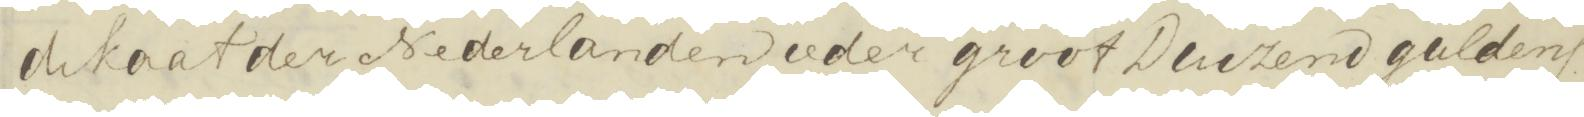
dikaat der Nederlanden ieder groot Duizend guldens
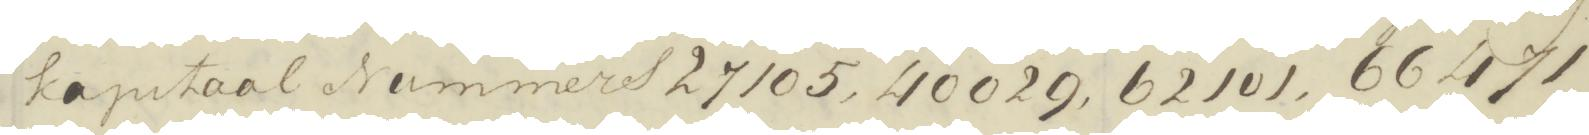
kapitaal Nummers 27105, 40029, 62101, 66471
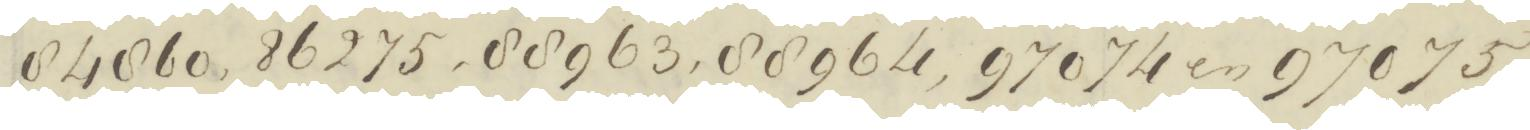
84860, 86275, 88963, 88964, 97074 en 97075
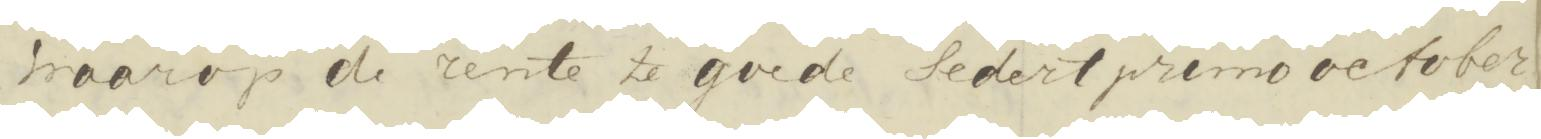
waarop de rente te goede sedert primo october
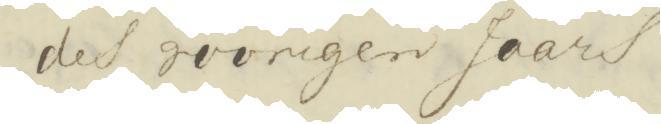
des voorigen Jaars
